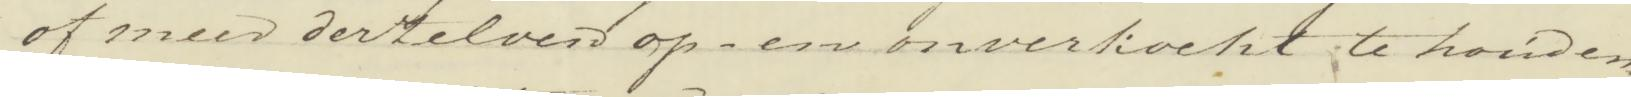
of meer derZelven op- en onverkocht te houden
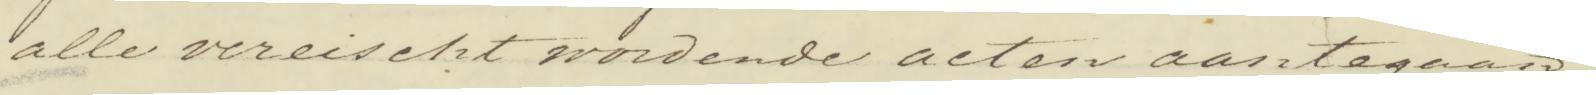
alle vereischt wordende acten aantegaan,
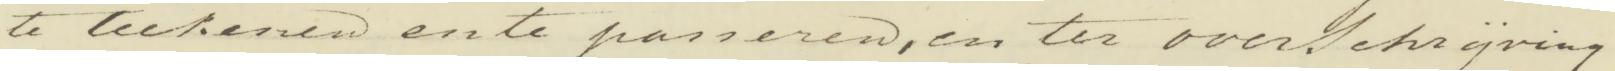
te teekenen en te passeren, en ter overschrijving
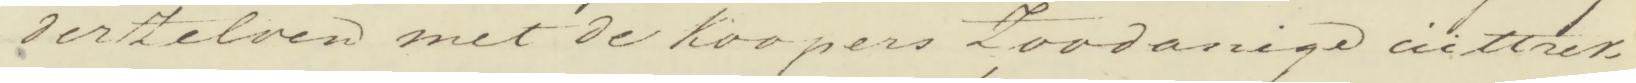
derZelven met de koopers zoodanige uittrek,
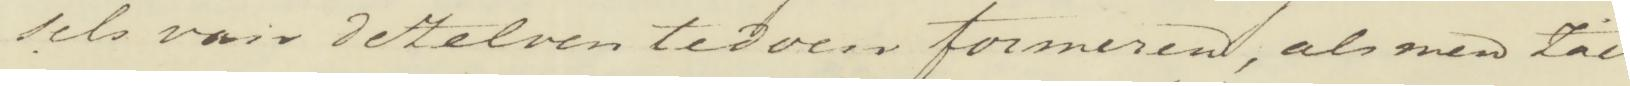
sels van deZelven te doen formeren, als men Zal
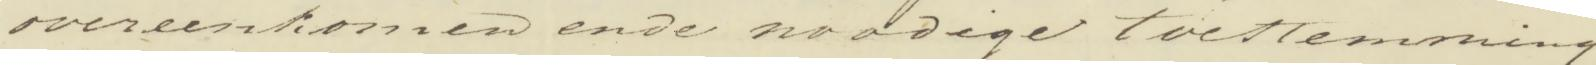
overeenkomen ende noodige toestemming
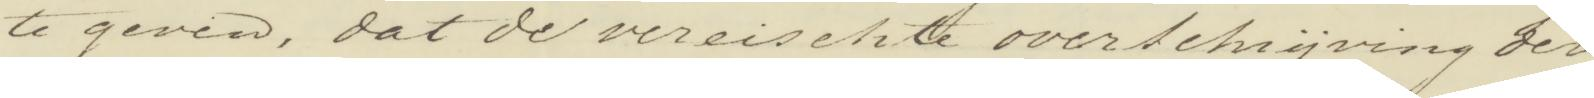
te geven, dat de vereischte overschrijving der
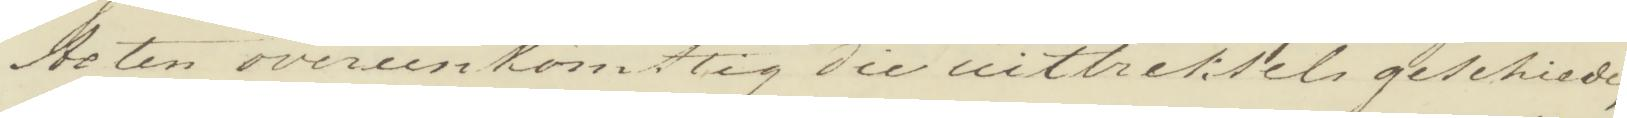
Acten overeenkomstig die uittreksels geschiede,
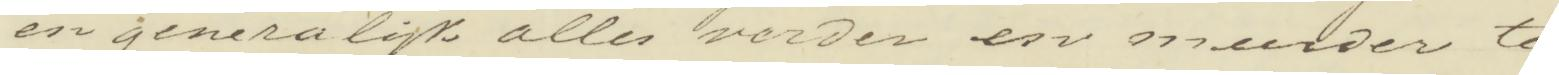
en generalijk alles verder en meerder te
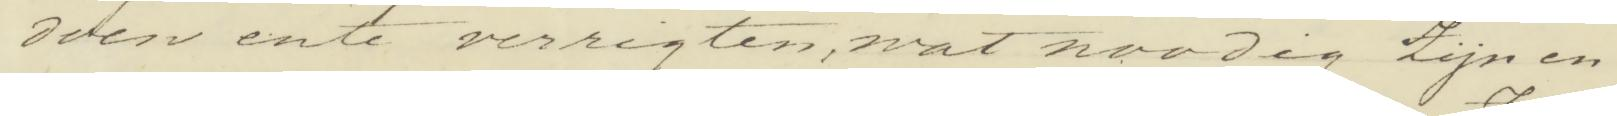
doen en te verrigten, wat noodig zijn en
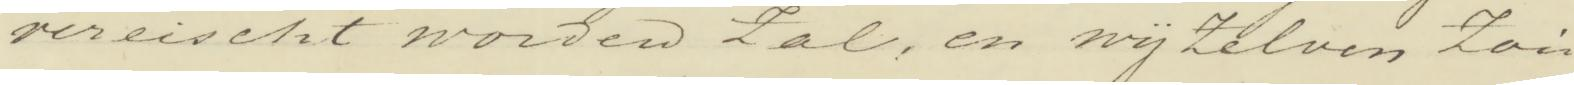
vereischt worden Zal, en wij Zelven Zou
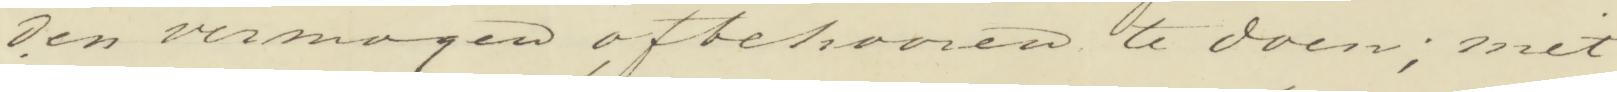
den vermogen ofbehooren te doen; met
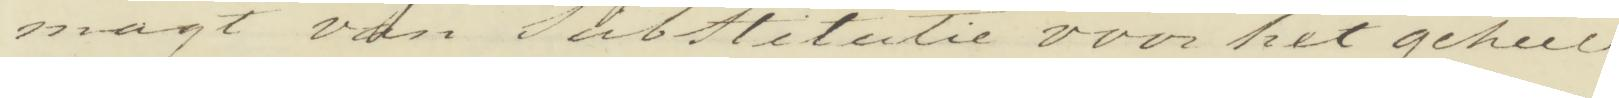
magt van Substitutie voor het geheel
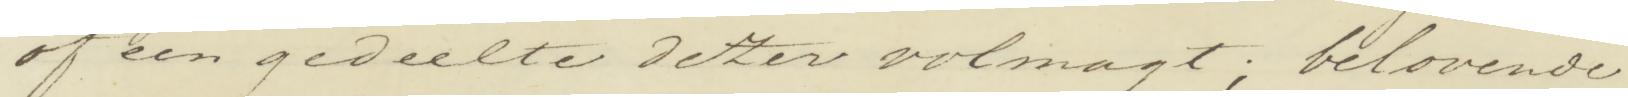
of een gedeelte deZer volmagt; belovende
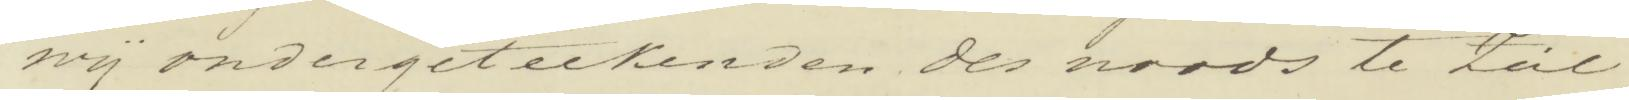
wij ondergeteekenden des noods te Zul
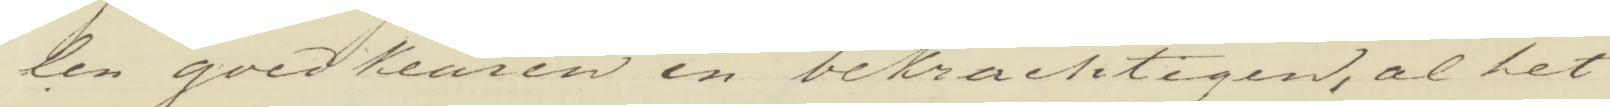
len goedkeuren en bekrachtigen, al het
